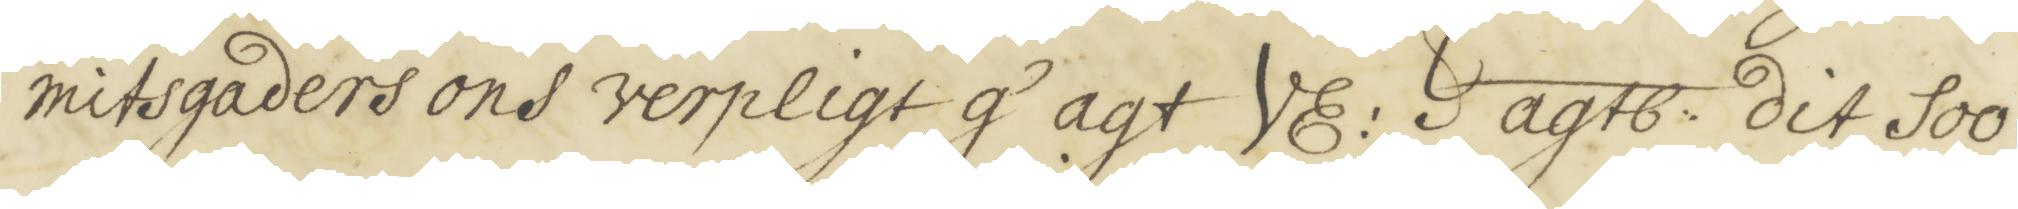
mitsgaders ons verpligt g’agt VE: H agtb: dit soo
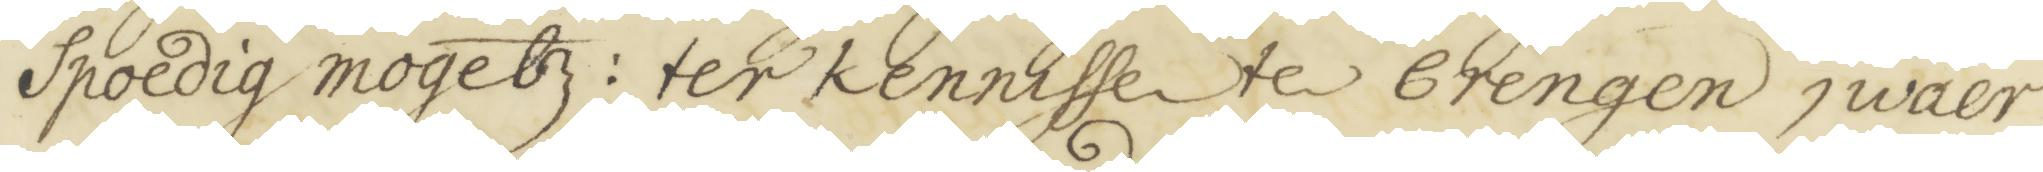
spoedig mogelijk: ter kennisse te brengen, waer
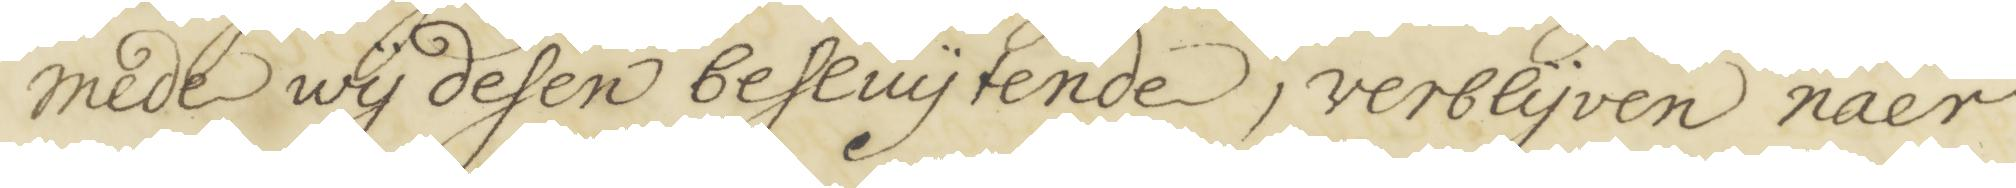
mede wij desen besluijtende, verblijven naer
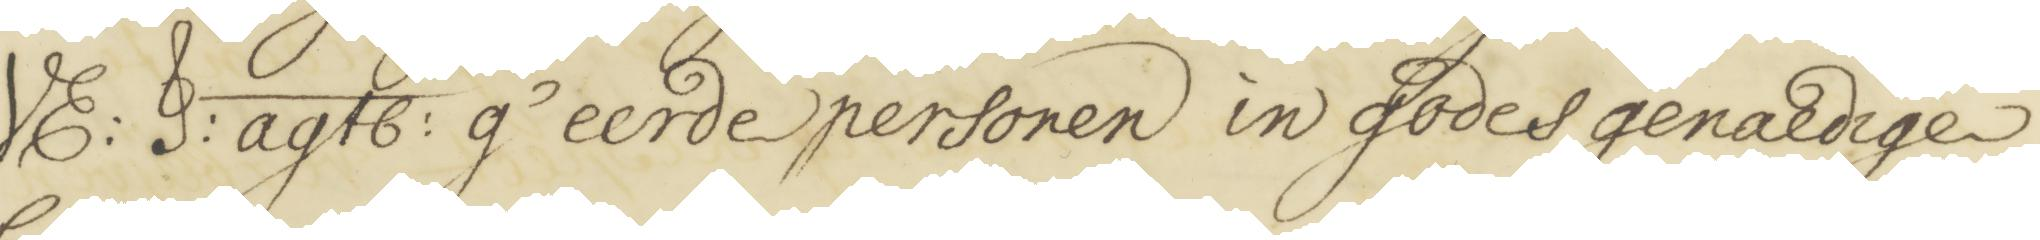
VE: H: agtb: g’eerde personen in godes genaedige
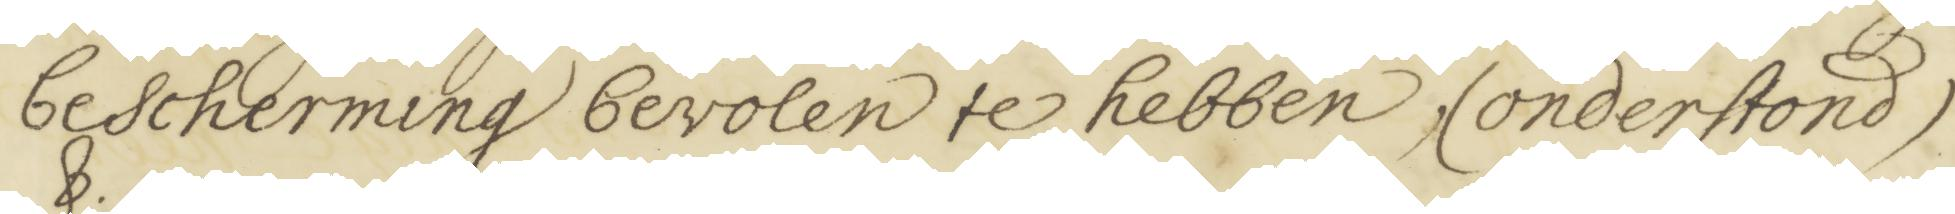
bescherming bevolen te hebben, (onderstond)
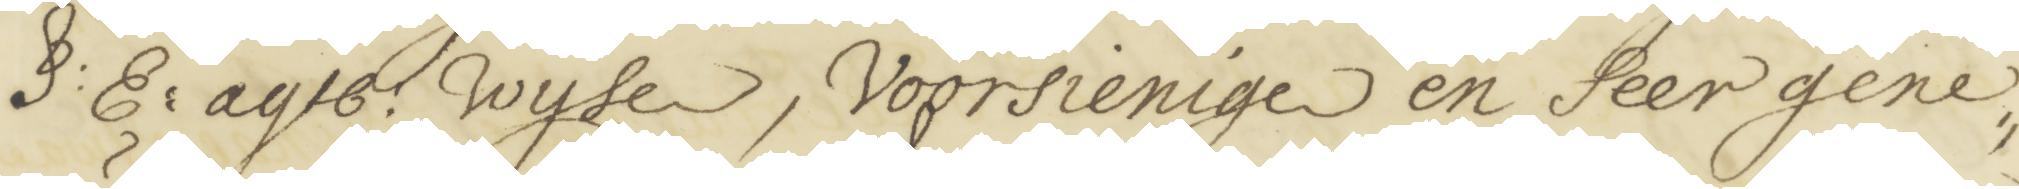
H:E: agtb: wijse, voorsienige en seer gene„
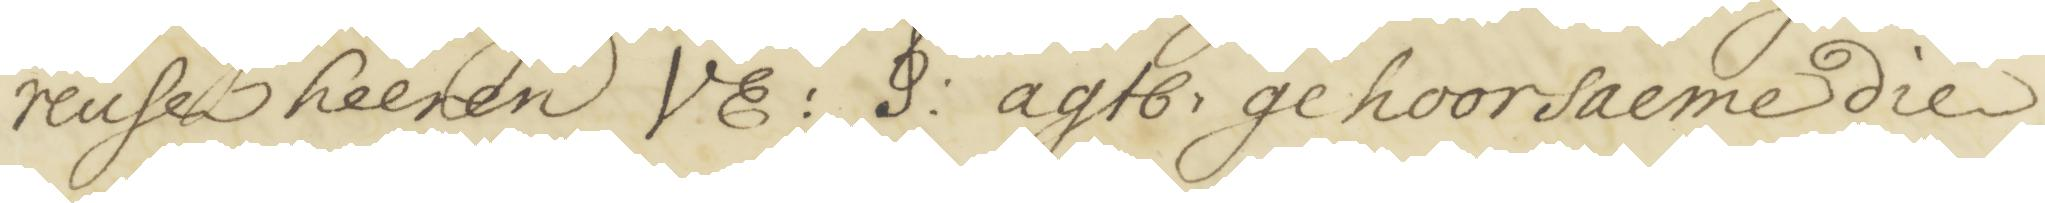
reuse heeren VE: H: agtb: gehoorsaeme die
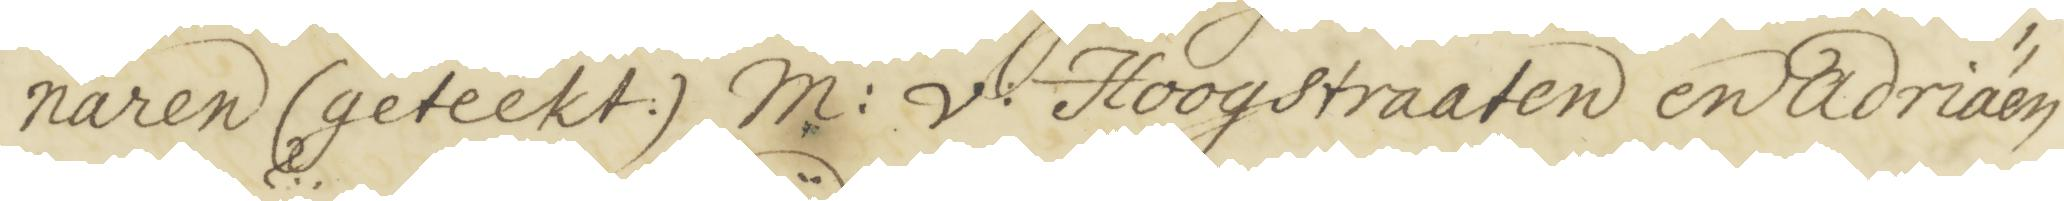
naren (geteekt:) M: v: Hoogstraaten en Adriaen
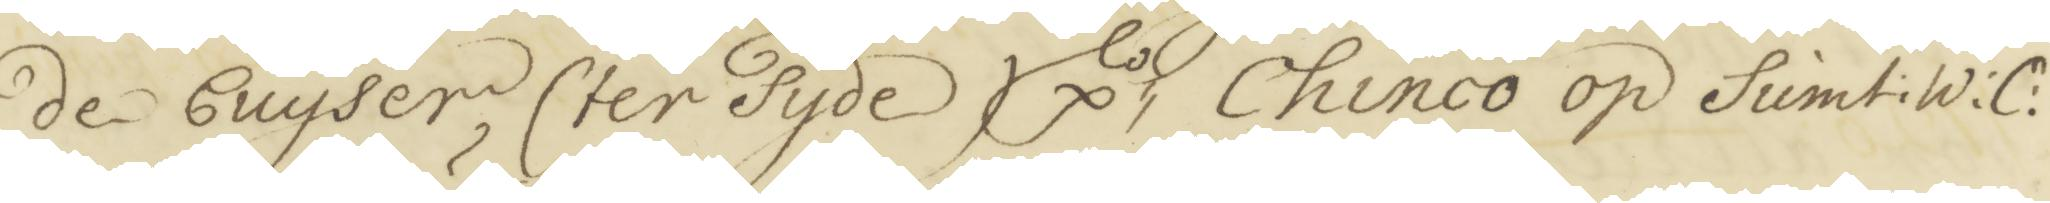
de buijser (ter sijde p„lo Chinco op Sumt: W:C:
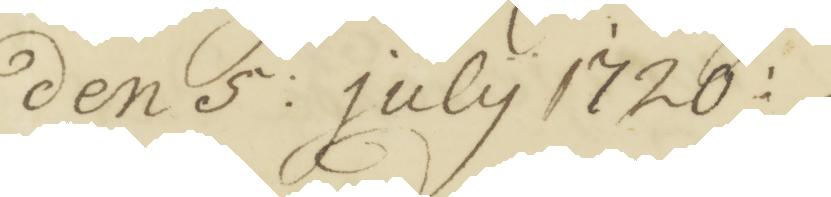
den 5: Julij 1720: -
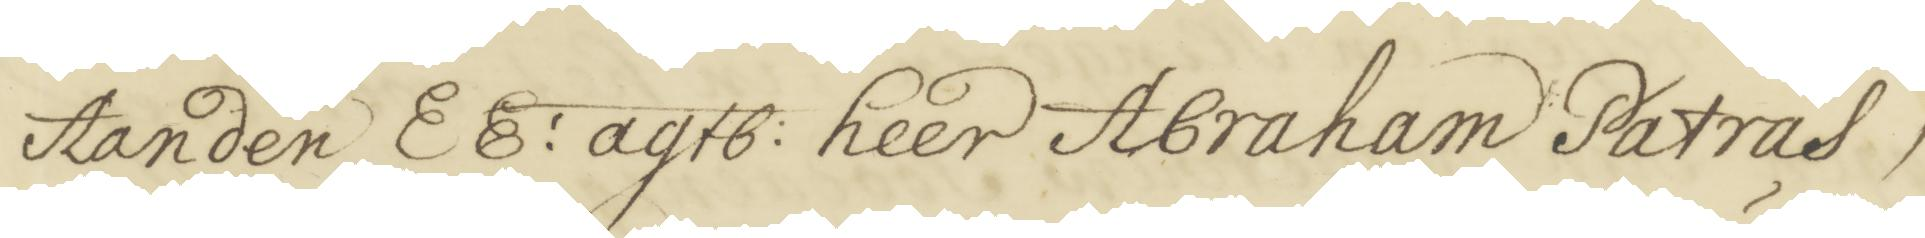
Aan den EE: agtb: heer Abraham Patras,
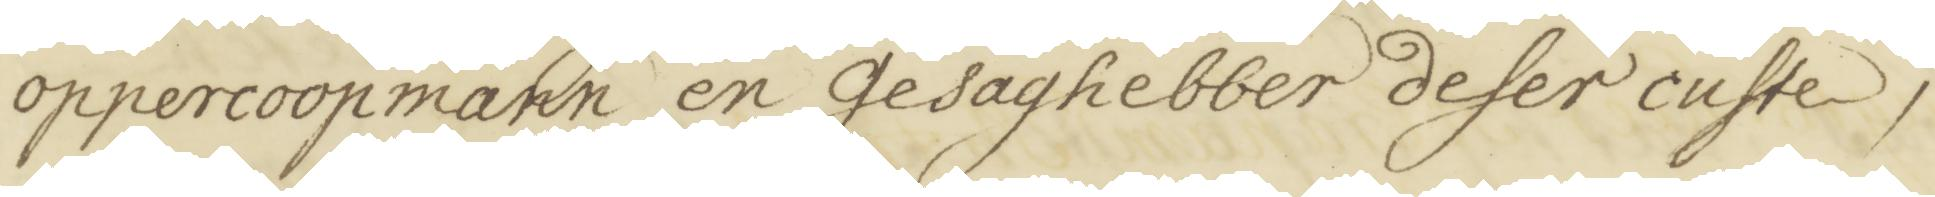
oppercoopmann en gesaghebber deser custe,
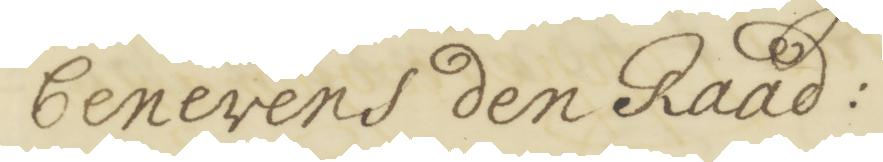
benevens den Raad:
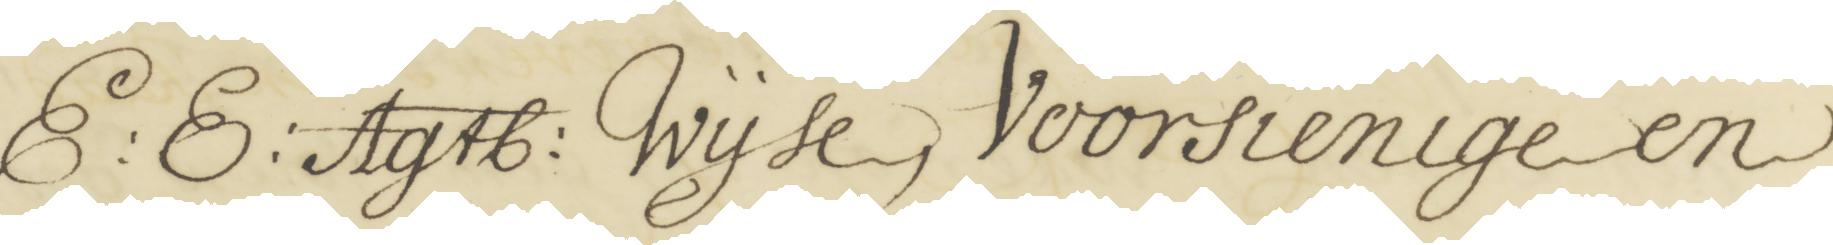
E:E: Agtb: Wijse, Voorsienige en
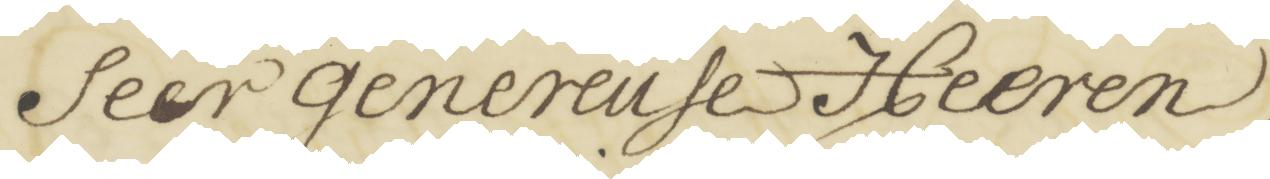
seer genereuse Heeren,
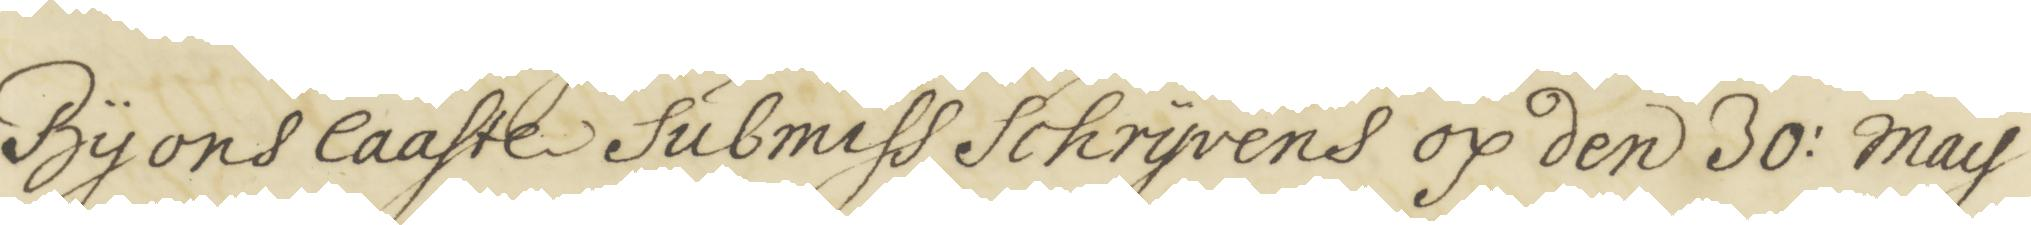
Bij ons laaste submiss schrijvens op den 30: maij
